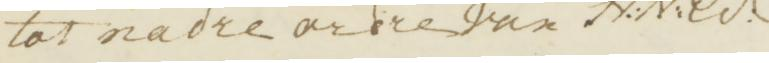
tot nadre ordre van H:H:Ed:
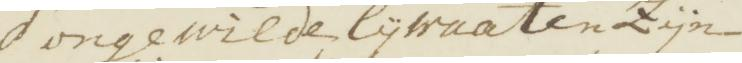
d'ongewilde lijwaaten zijn
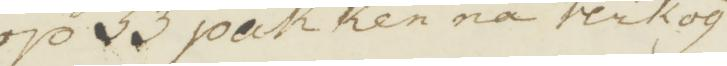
op 53 pakken na verkogt
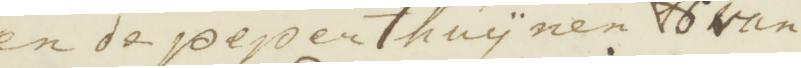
en de peperthuijnen et=a van
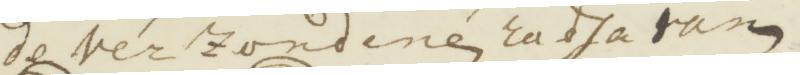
de verzondene radja van
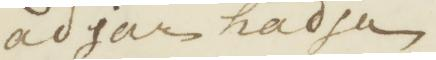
adjarhadja
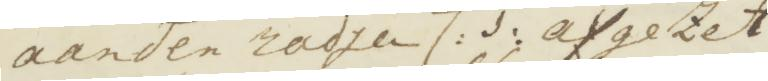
aan den radja c: s: afgezet
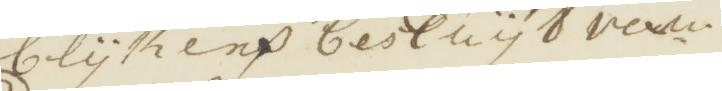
blijkens besluijt van
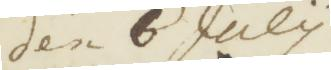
den 6 Julij
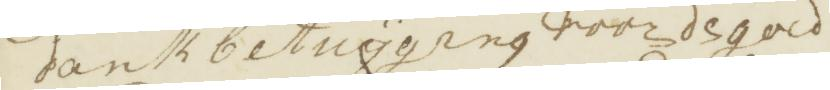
dank betuijging voor de goed
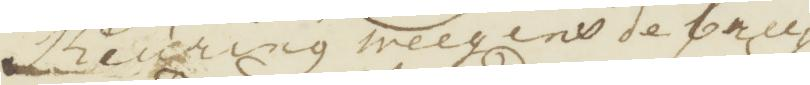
keuring weegens de bree
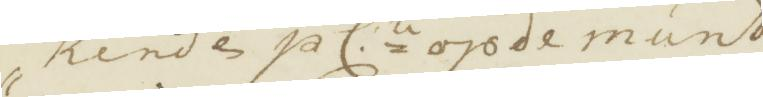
„kende pc.=t op de munt
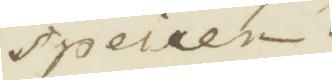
speicen.
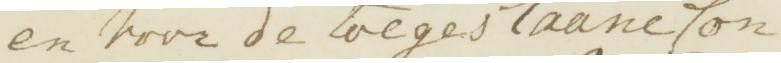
en voor de toegestaane con
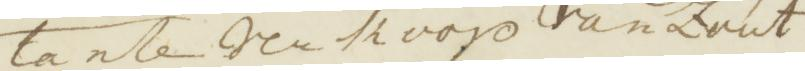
tante verkoop van zout
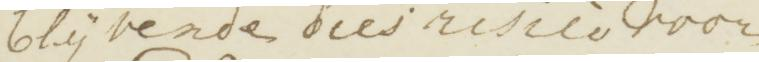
blijvende dies risico voor
